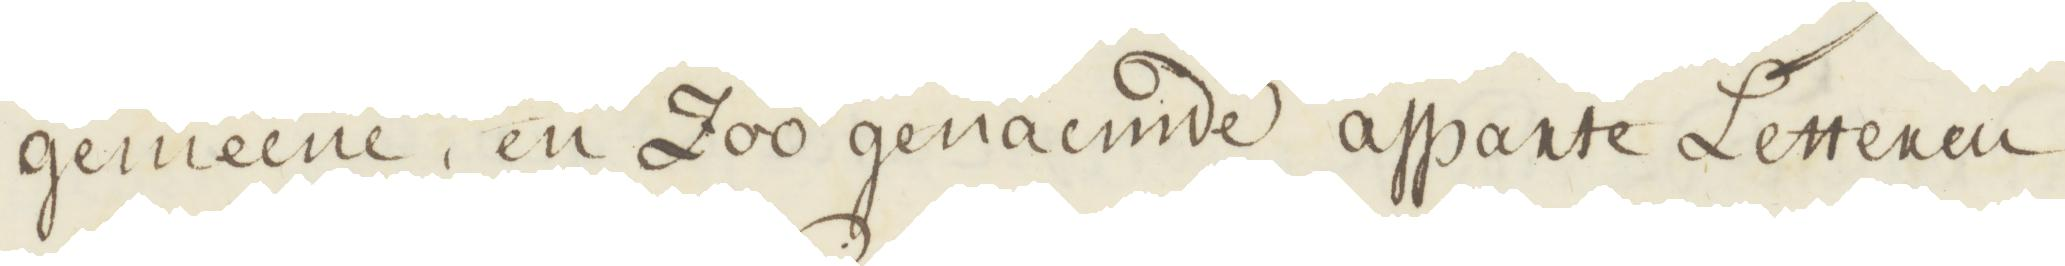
gemeene, en Zoo genaemde apparte Letteren
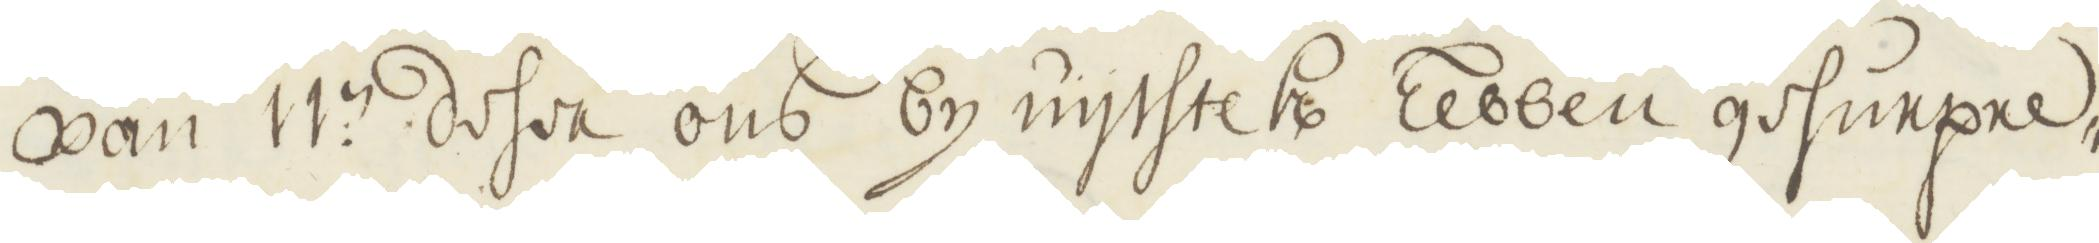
van 11:e deser ons by uijtstek hebben gesurpre„
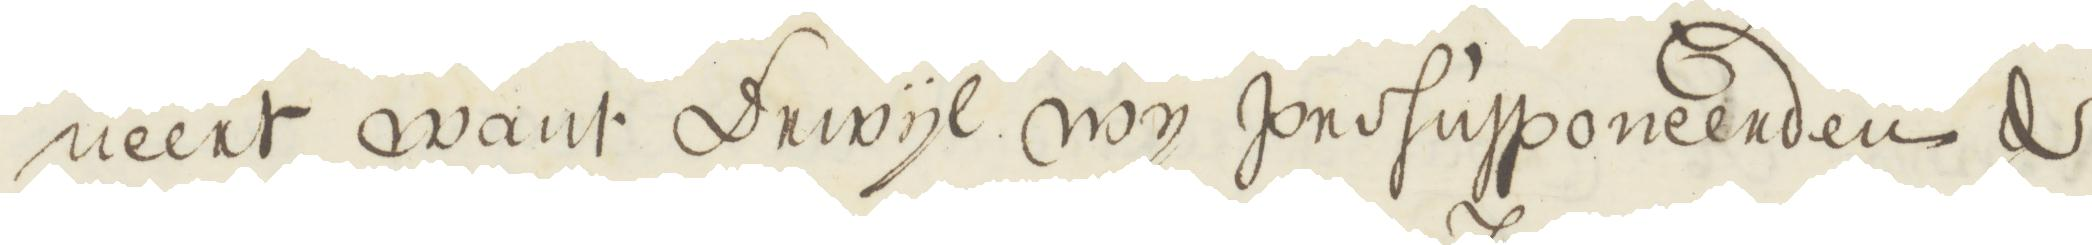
neert want terwijl wy presupponeerden de
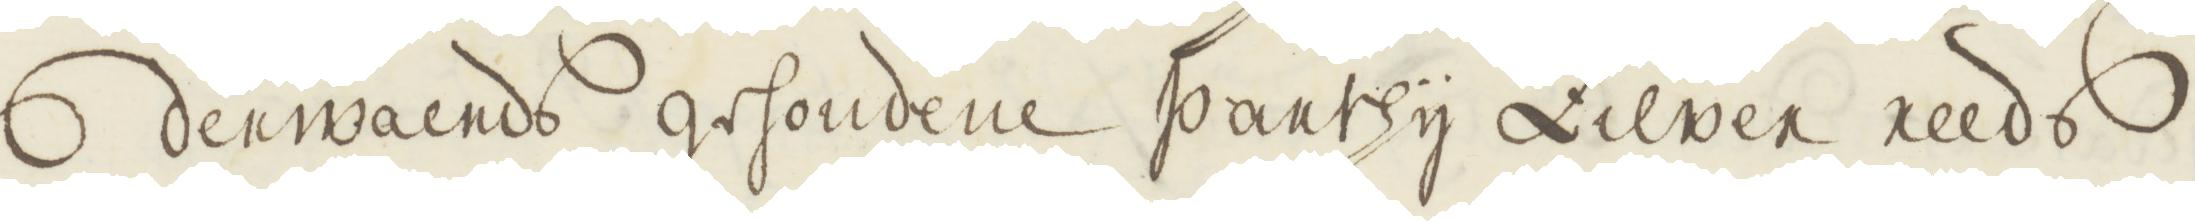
derwaerds gesondene parthij Zilver reeds
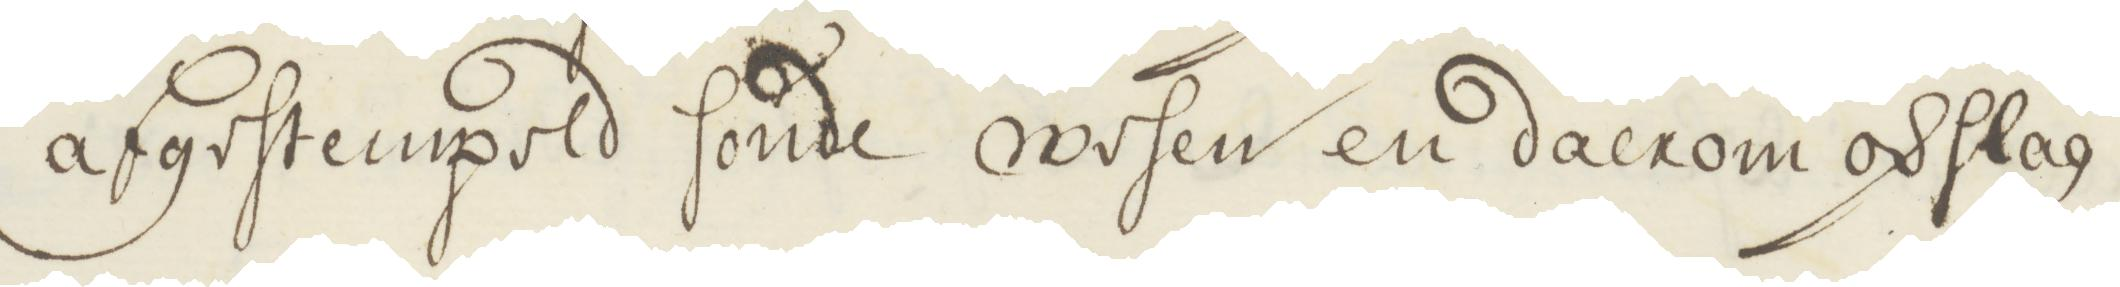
afgestempeld soude wesen en daerom overslag
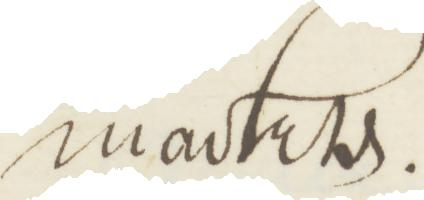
maekten.
